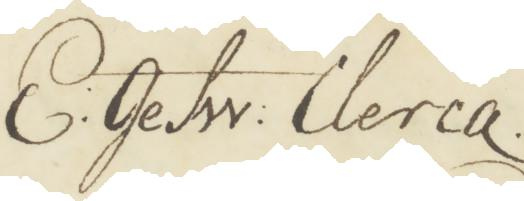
E: Gesw: Clercq
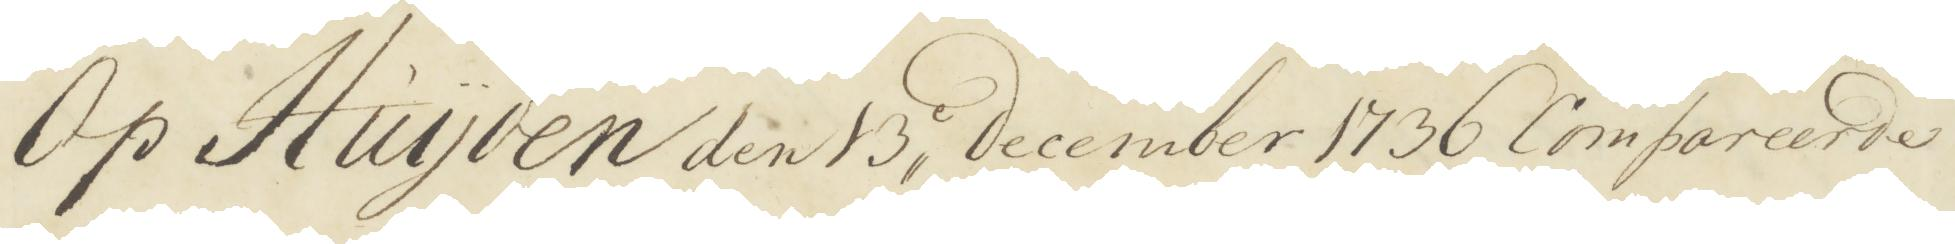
Op Huijden den 13„e december 1736 Compareerde
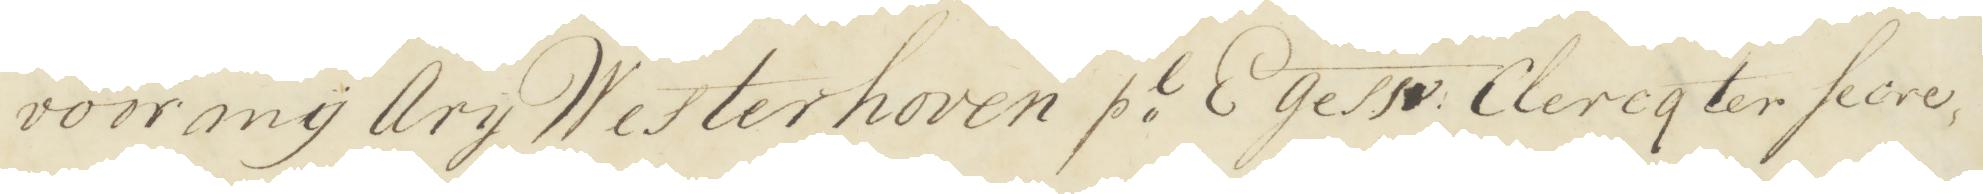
voor mij Arij Westerhoven p„l E gesw: Clercq ter secre„
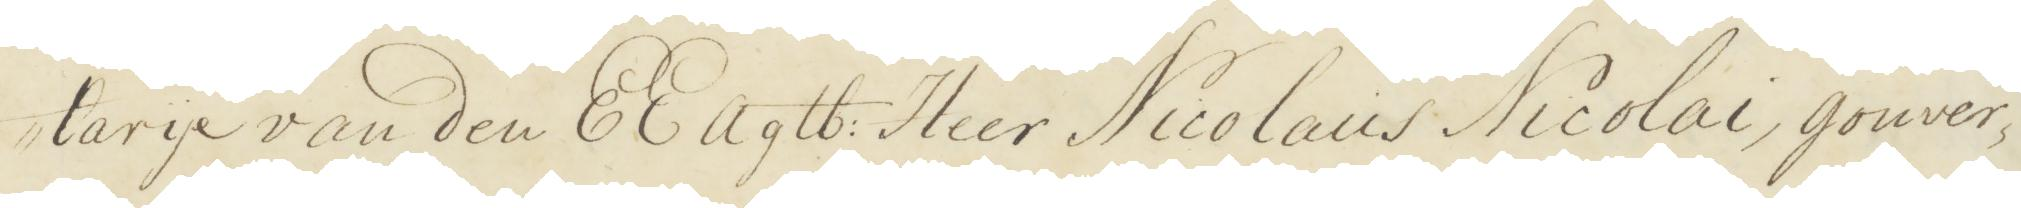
„tarije van den EE Agtb: Heer Nicolaus Nicolai, gouver„
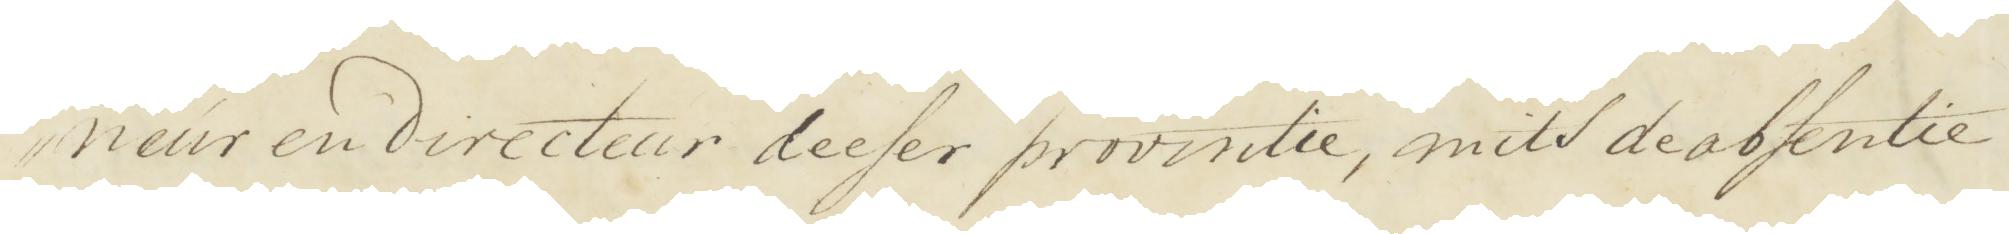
„neur en directeur deeser provintie, mits de absentie
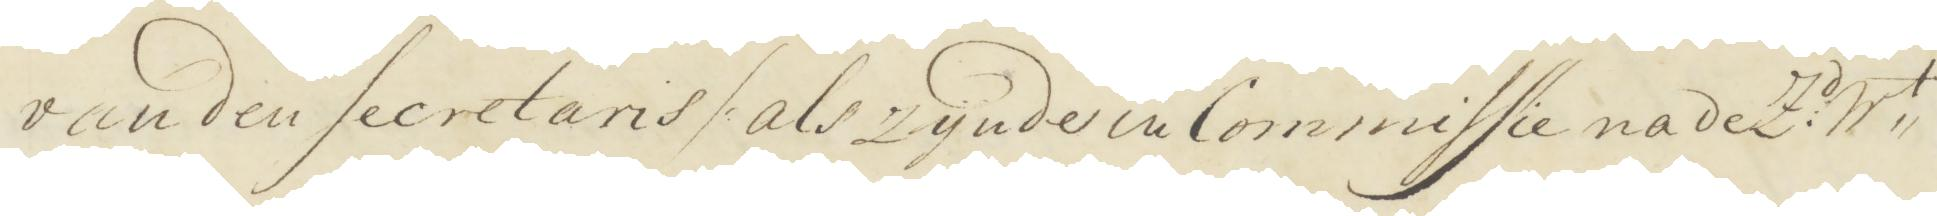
van den secretaris /:als zijnde in Commissie na de Z:d W„t
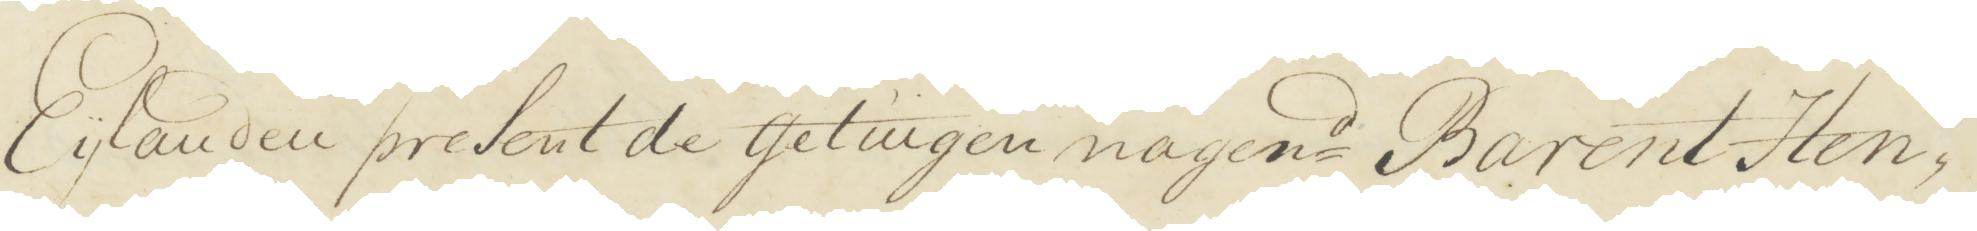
Eijlanden present de getuigen nagen=d Barent Hen„
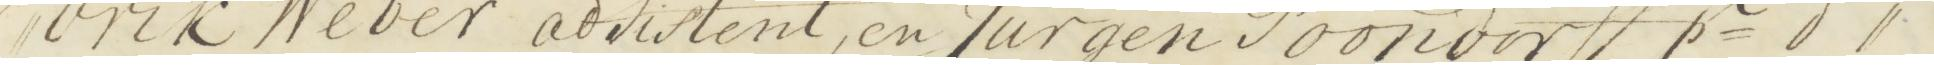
„drik Weder adsistent, en Jurgen Poondorff p=l d„le
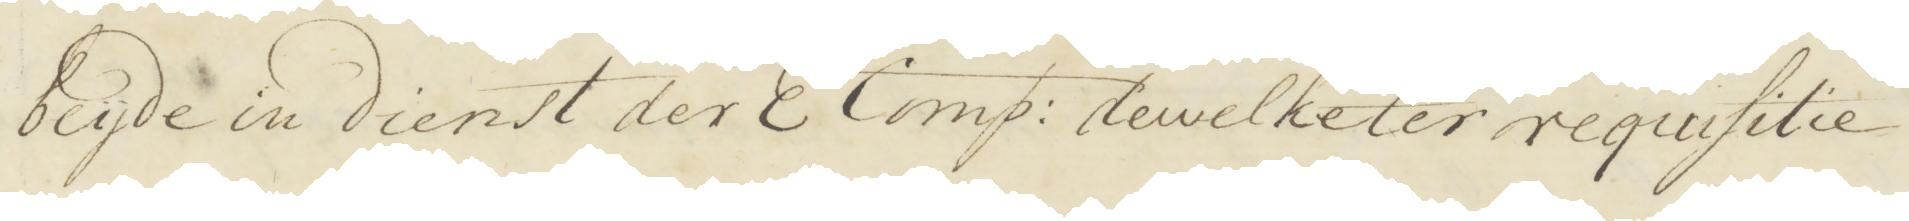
beijde in dienst der E Comp: dewelke ter requisitie
